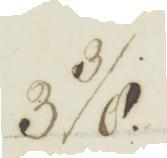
3 3/8.
